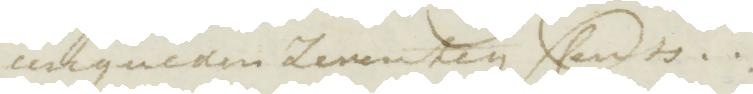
een gulden Zeventig Cents. . . . .
